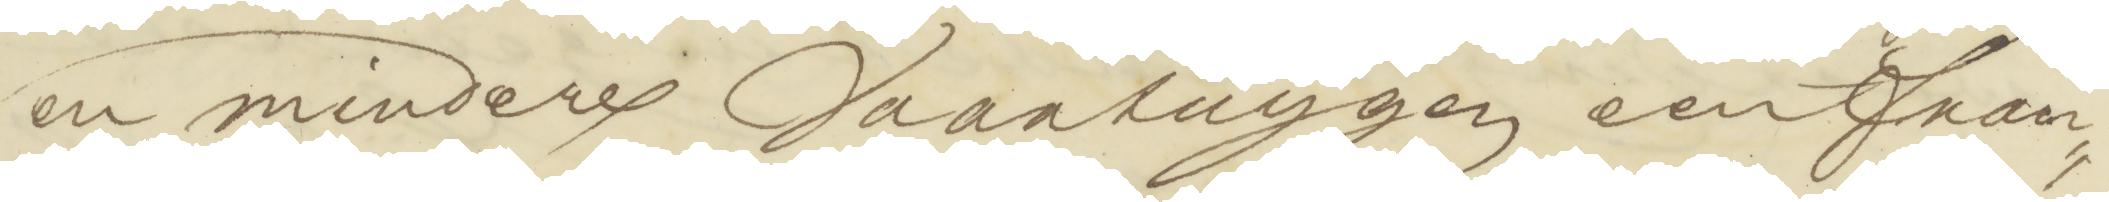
en mindere Vaartuijgen een fran„
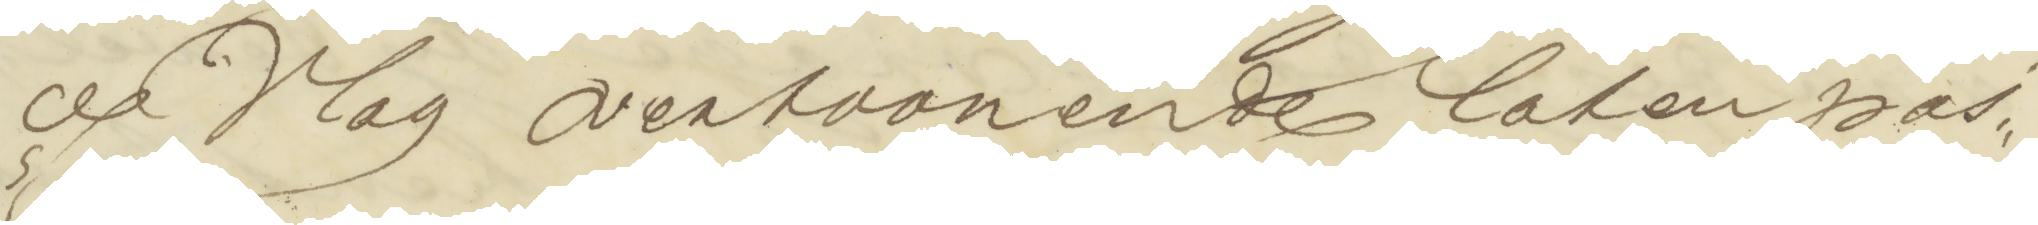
„ces Vlag vertoonende laten pas„
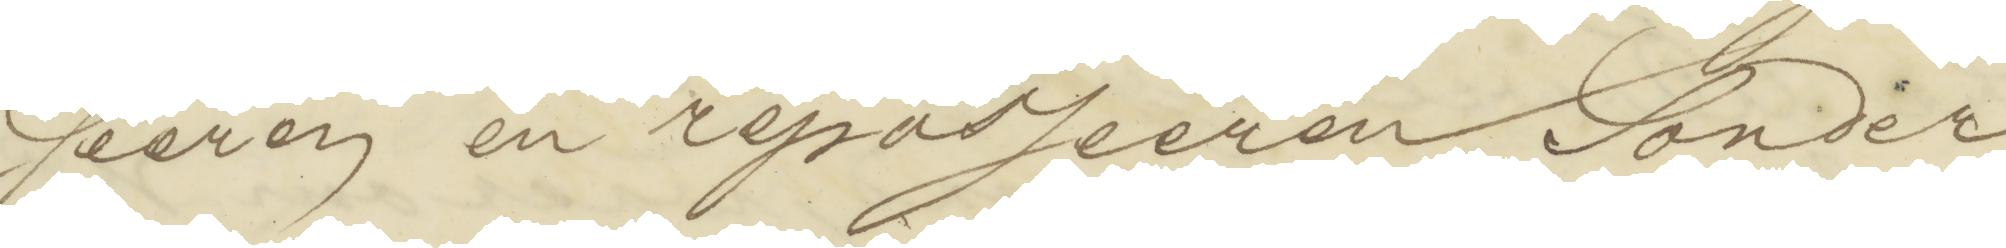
seeren en repasseeren sonder
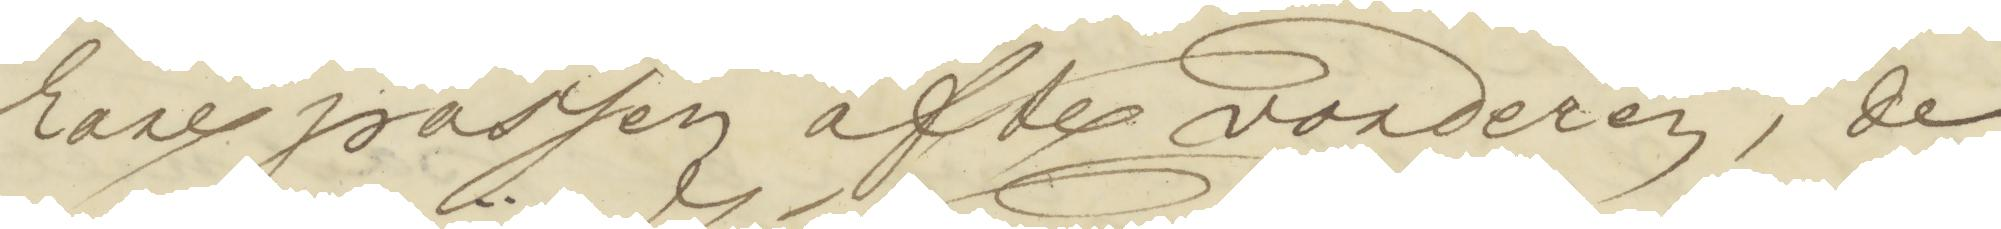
hare passen af te vorderen, de
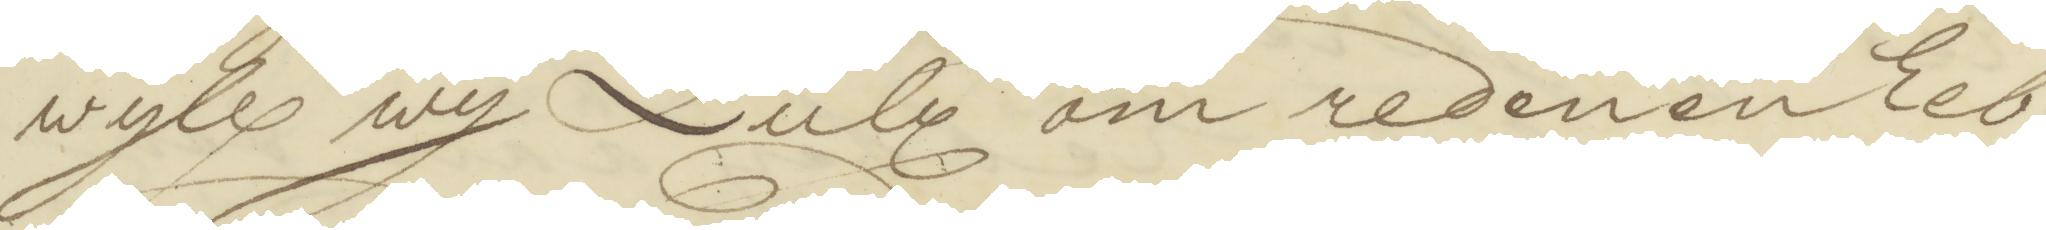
wijle wij Zulx om redenen heb
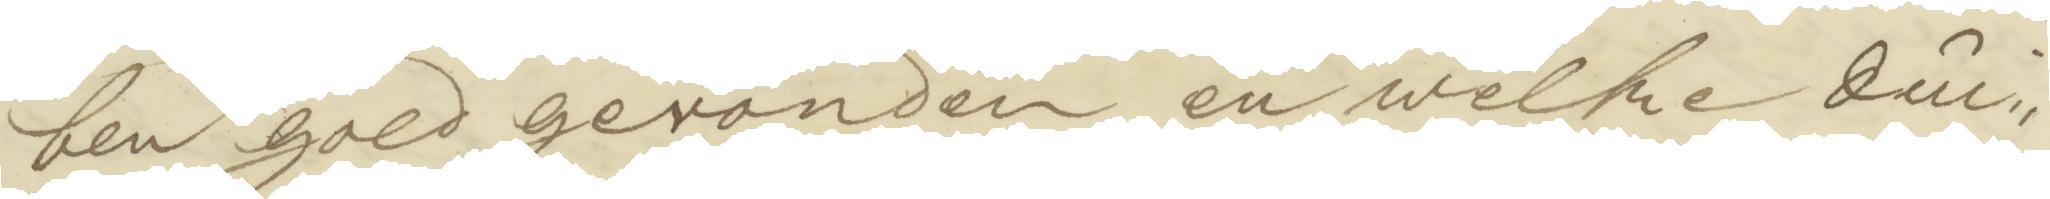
ben goed gevonden en welke dui„
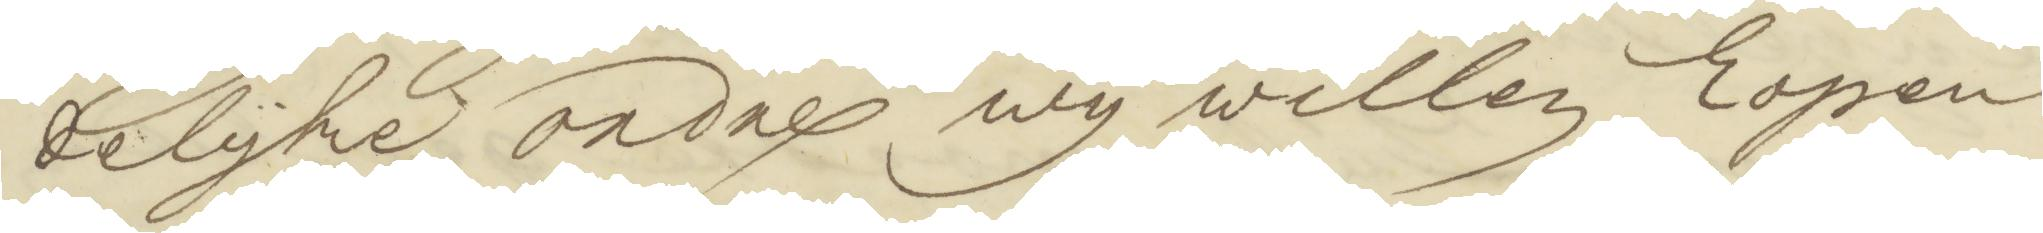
delijke ordre wij willen hopen
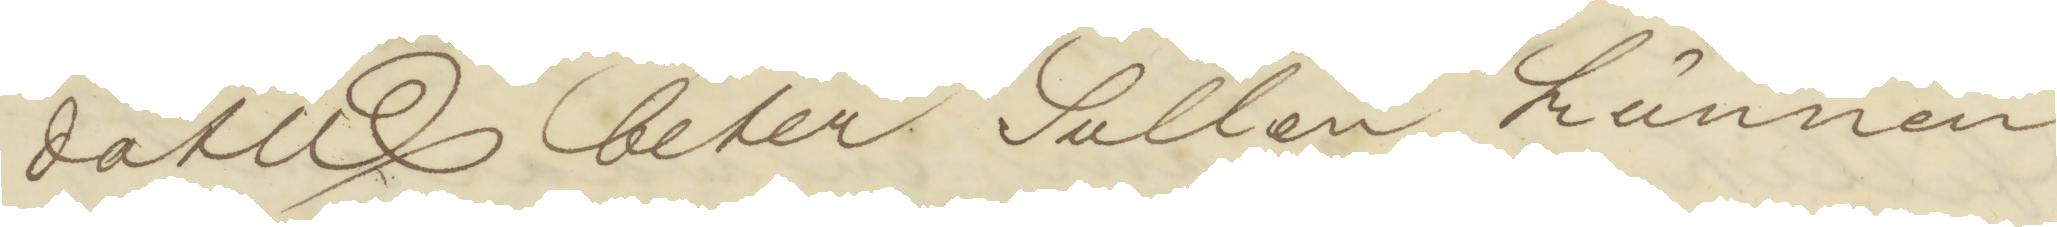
datUE beter sullen kunnen
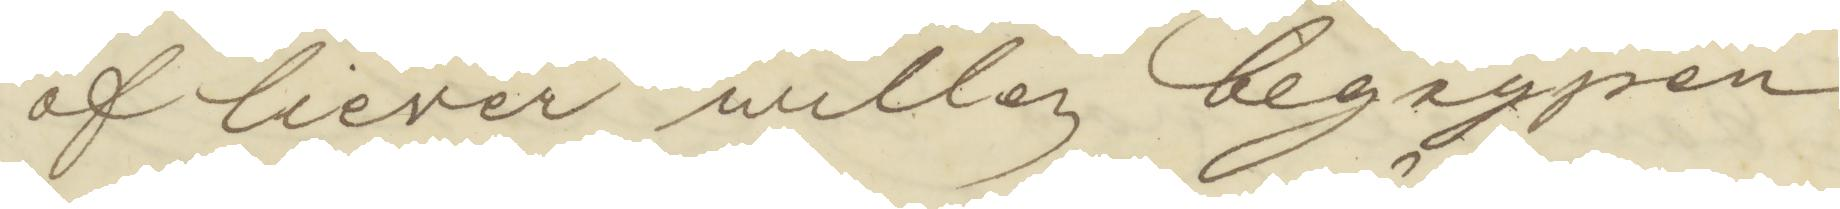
of liever willen begrijpen
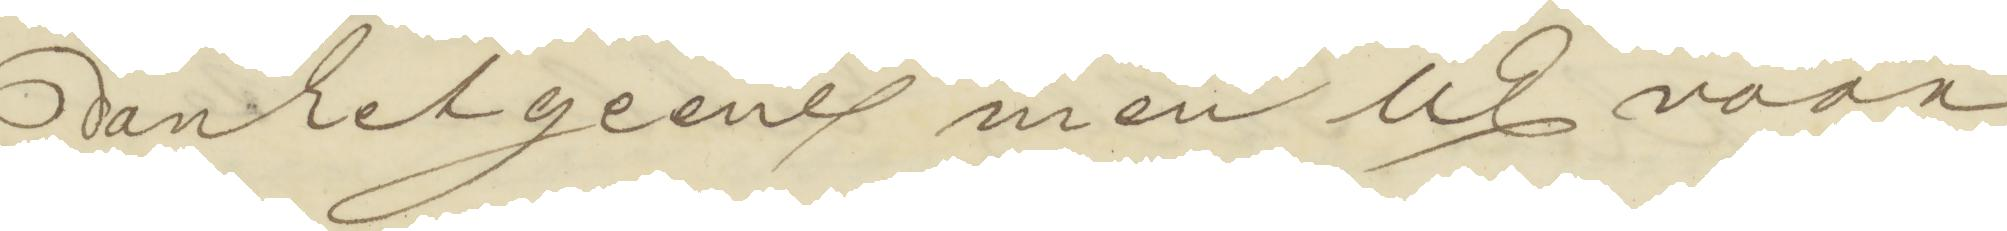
dan het geene men uE voor
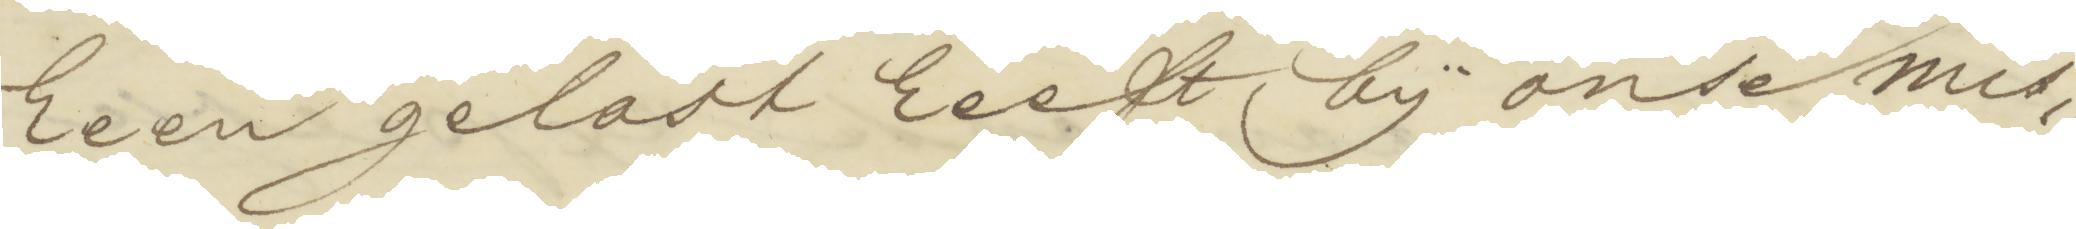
heen gelast heeft, bij onse mis„
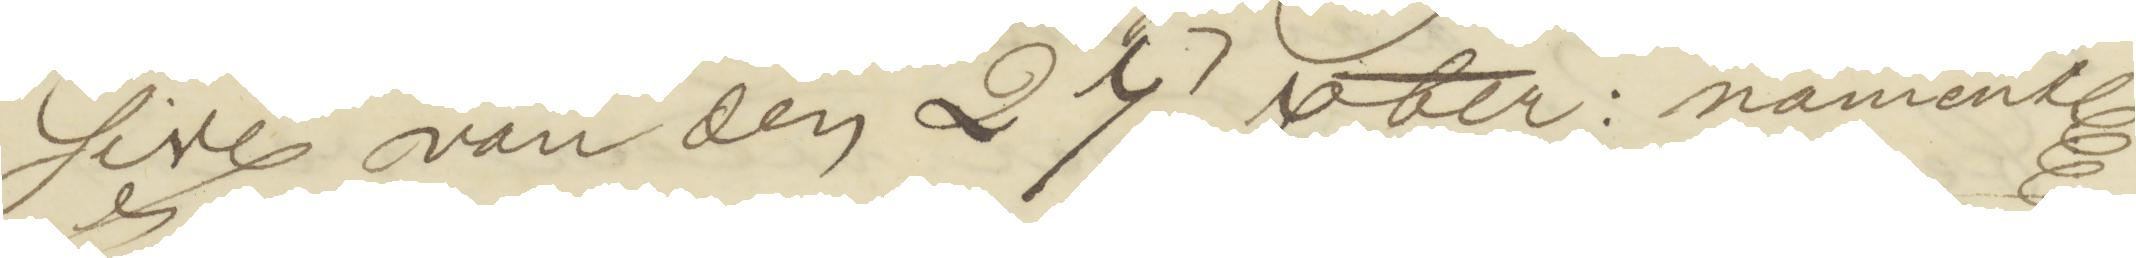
sive van den 27.' xber: namentl
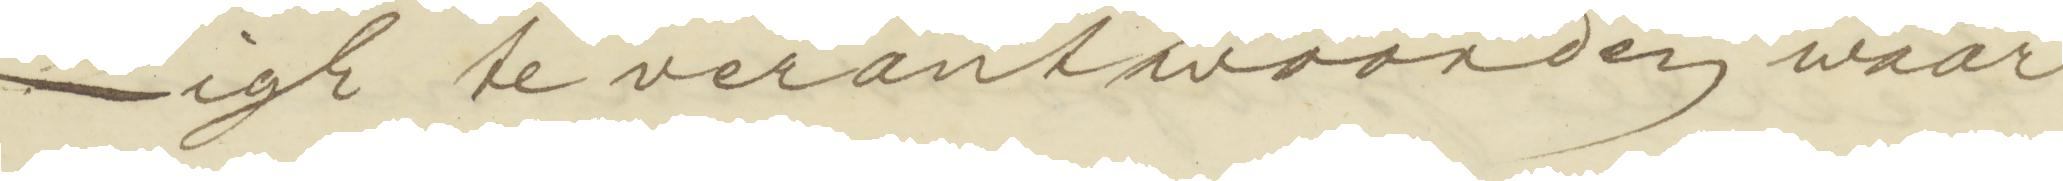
Zigh te verantwoorden waar
